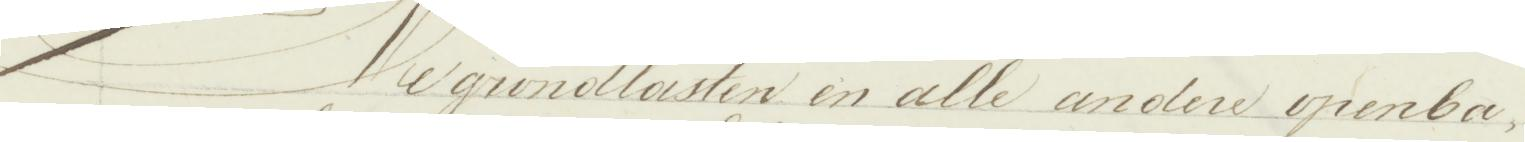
De grondlasten en alle andere openba„
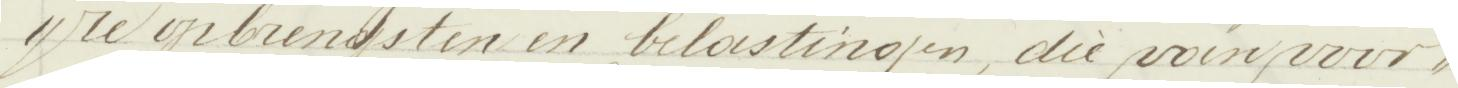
„re opbrengsten en belastingen, die van voor„
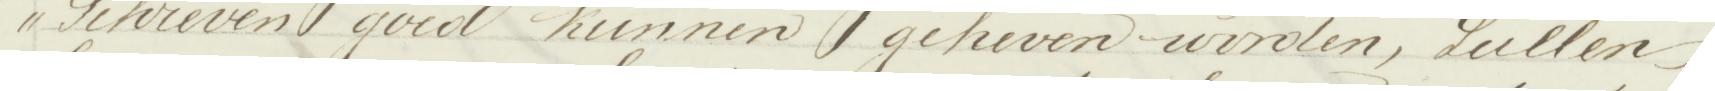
„schreven goed kunnen geheven worden, sullen
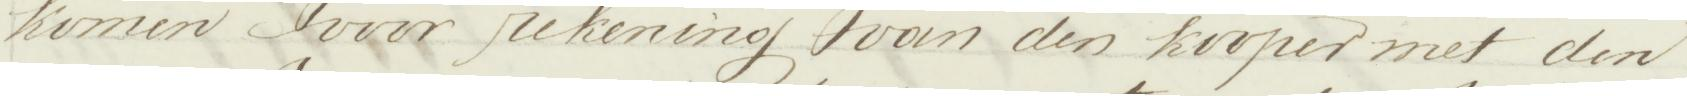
komen voor rekening van den kooper met den
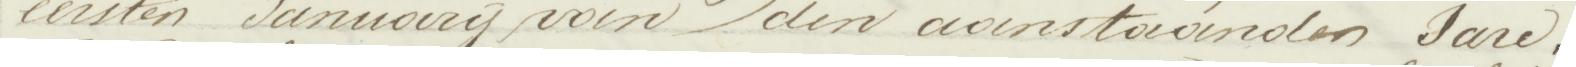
eersten Januarij van den aanstaanden Jare.
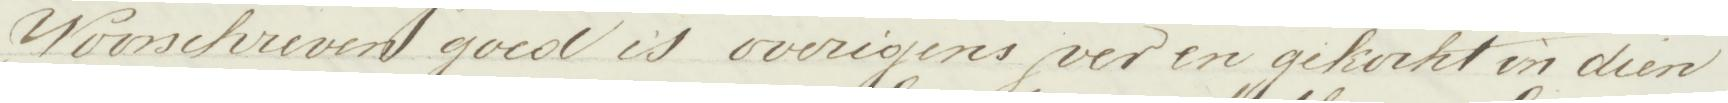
Voorschreven goed is overigens ver en gekocht in dien
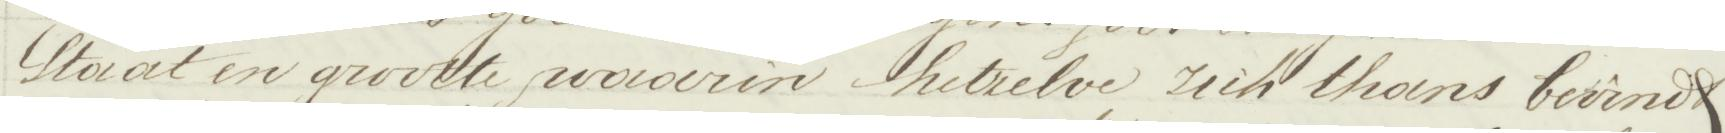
staat en grootte waarin hetzelve zich thans bevindt
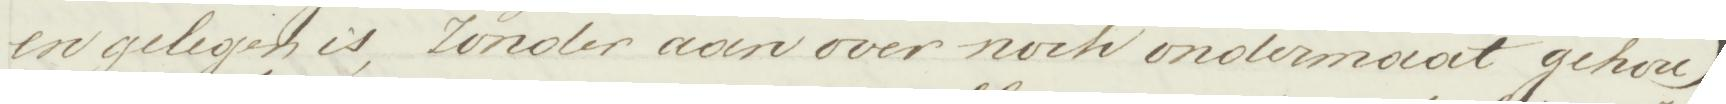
en gelegen is, zonder aan over noch ondermaat gehou
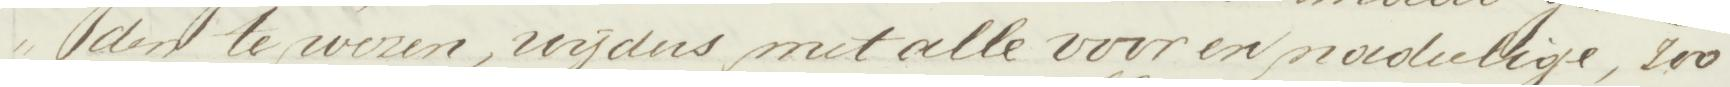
„den te wezen, wijders met alle voor en nadeelige, zoo
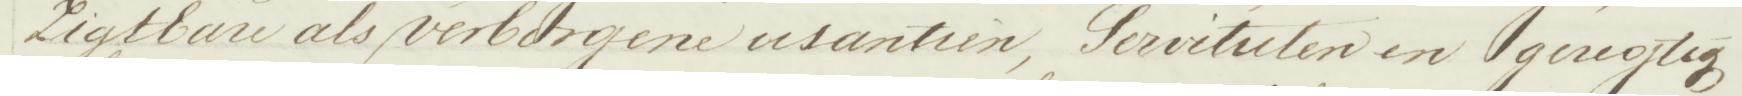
zigtbare als verborgene usantien, servituten en geregtig
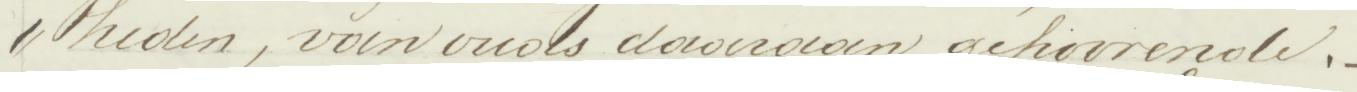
„heden, van ouds daaraan gehoorende.
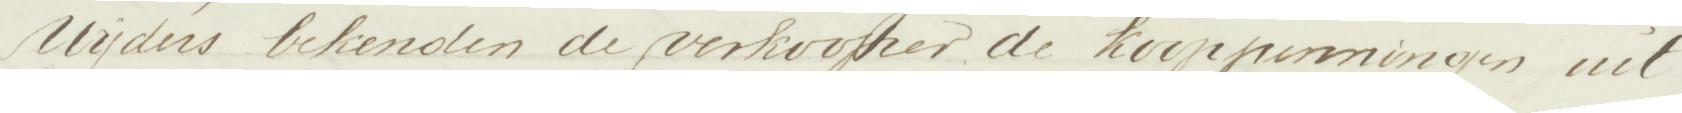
Wijders bekenden de verkooper de kooppenningen uit
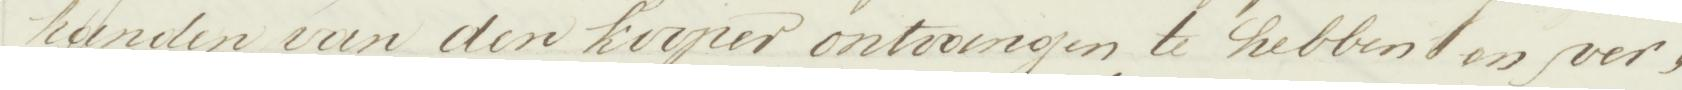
handen van den kooper ontvangen te hebben en ver„
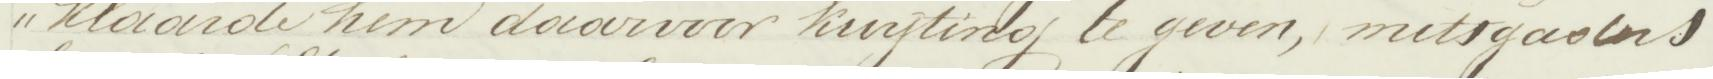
„klaarde hem daarvoor Kuijting te geven, mitsgaders
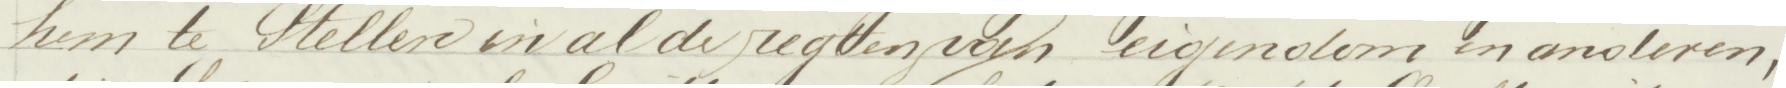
hem te stellen in al de regten van eigendom in anderen,
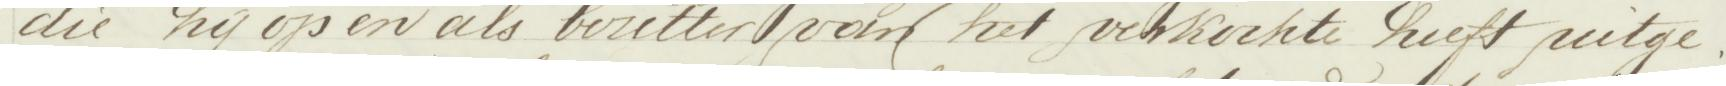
die hij op en als bezetter van het verkochte heeft uitge„
